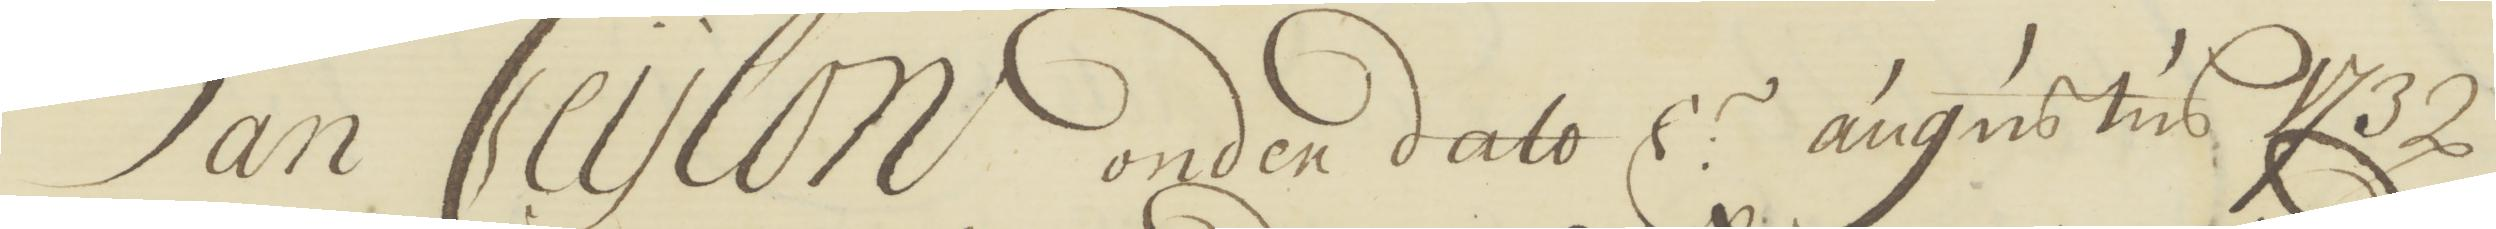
Van Ceijlon onder dato 5.e augustus 1732
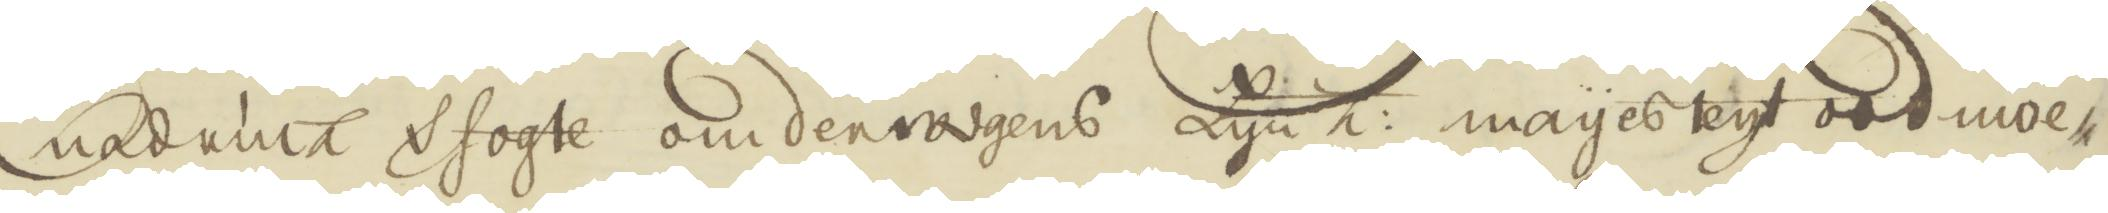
nadruck versogte om derwegens Zyn k: maijesteyt ood moe„
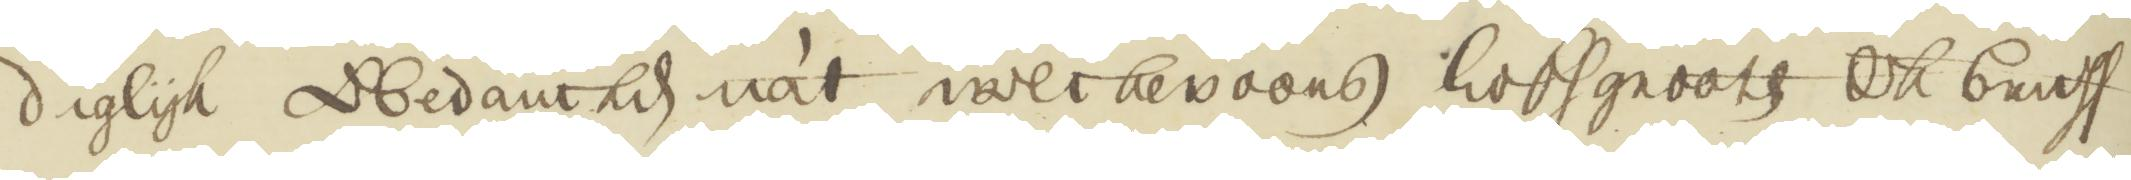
diglijk te bedancken na't welcke voors hoffgrooten de k brieff
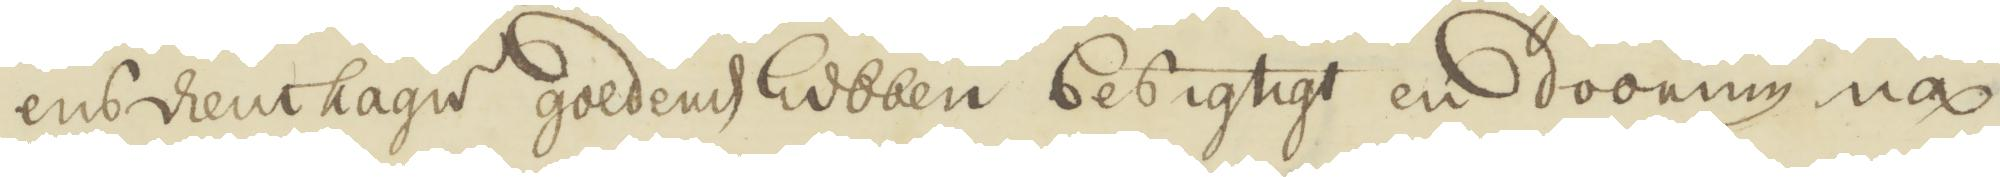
en schenckagie goederen hebben besigtigt en door my na
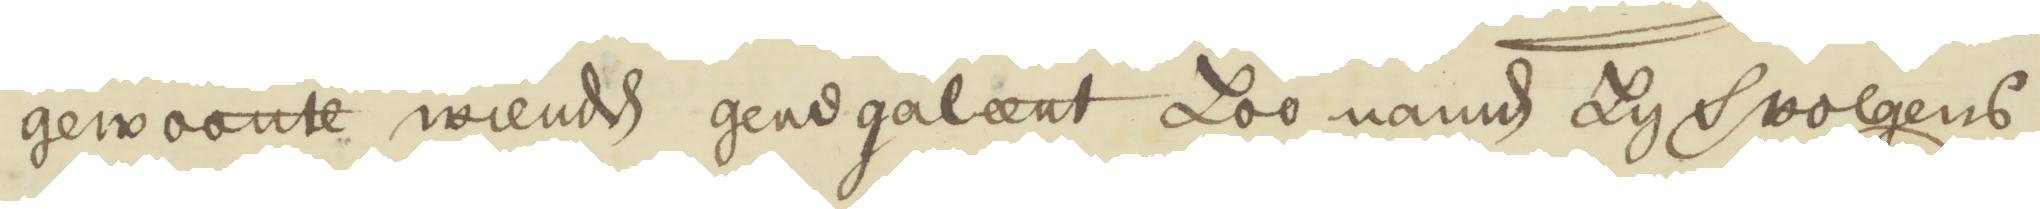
gewoonte wierden geregaleert zoo namen Zy vervolgens
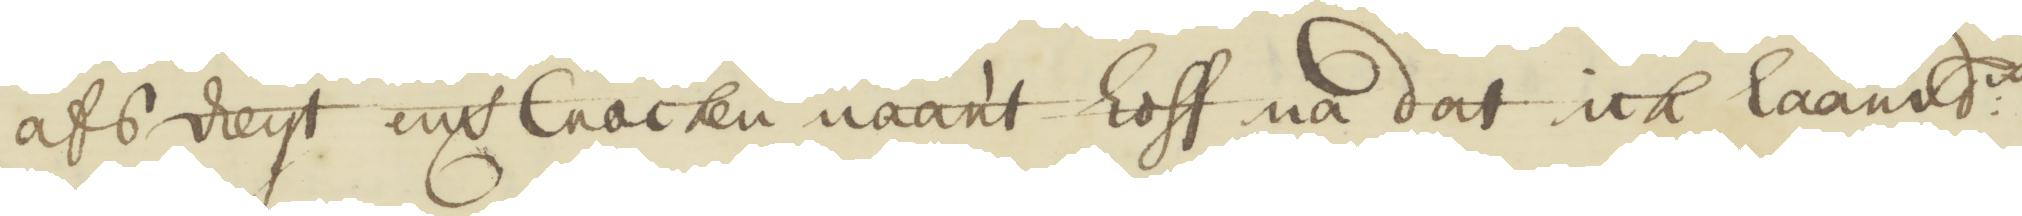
afscheyt enver trocken naar't hoff na dat ick haar Ed:s
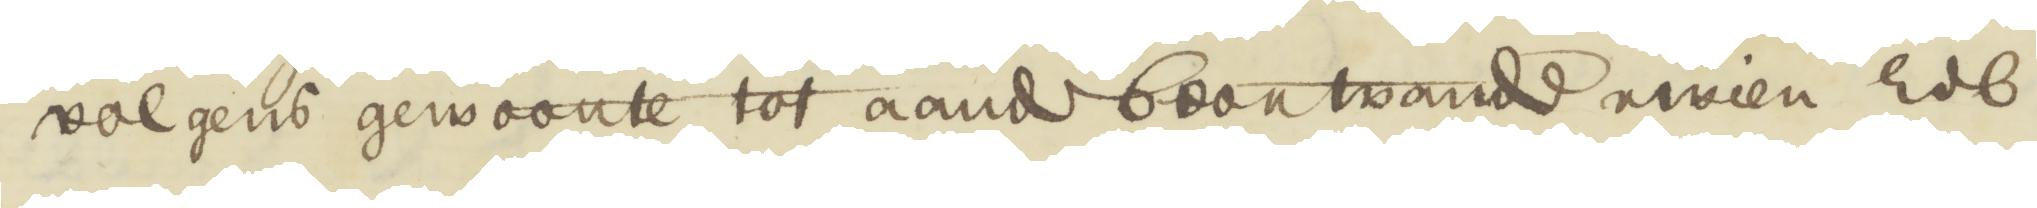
volgens gewoonte tot aande boort vande rivier heb
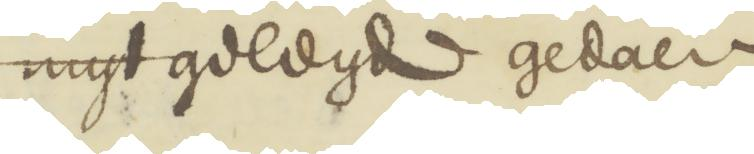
uyt geleyde gedaen
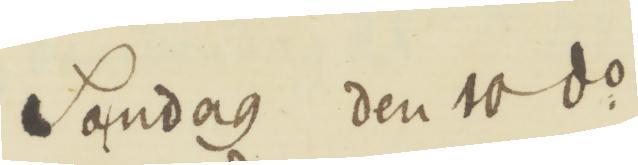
Sondag den 10 d:o
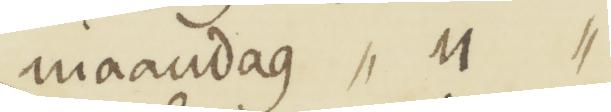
maandag „ 11 „
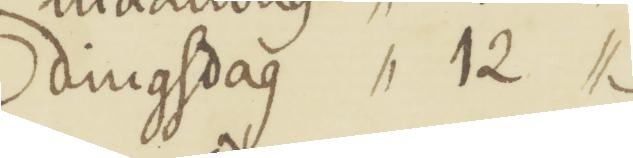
dingsdag „ 12 „
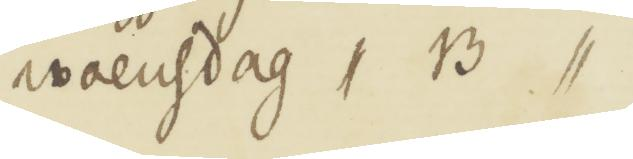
woensdag „ 13 „
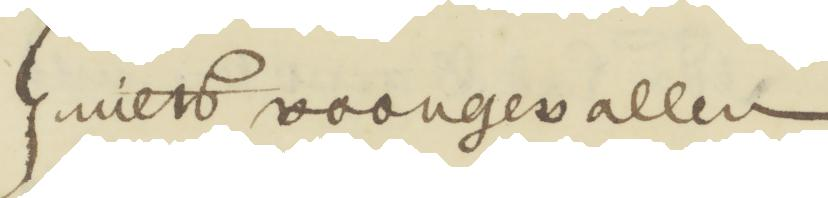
} niets voorgevallen
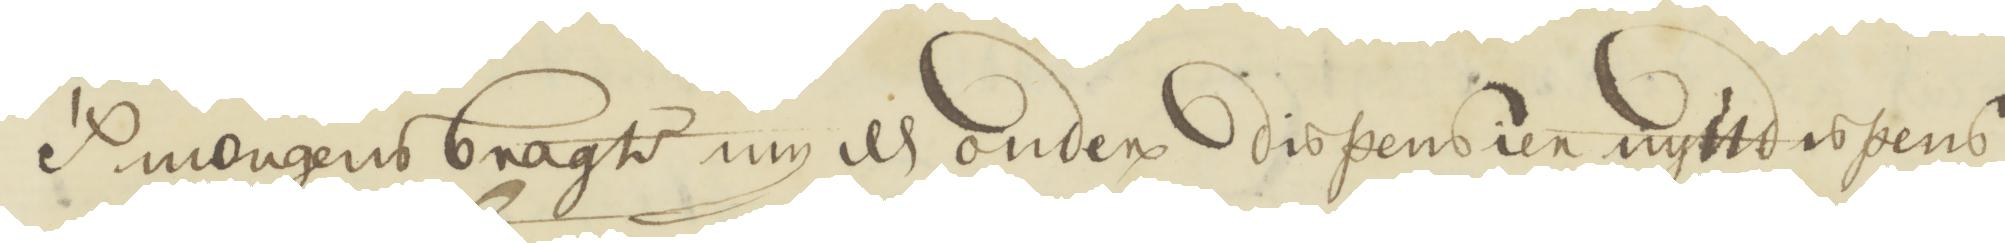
'S morgens bragte my een onder dispensier uyt t dispens
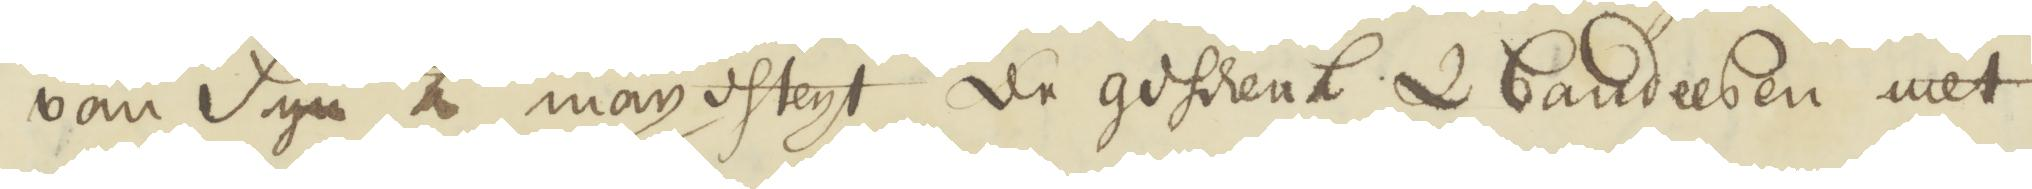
van Syn k mayesteyt ter geschenk 2 bandeesen met
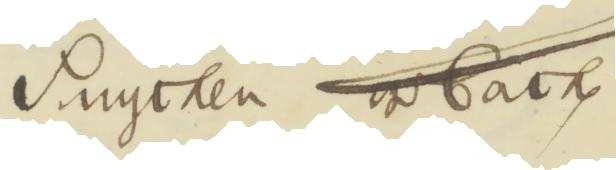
Suycker geback
